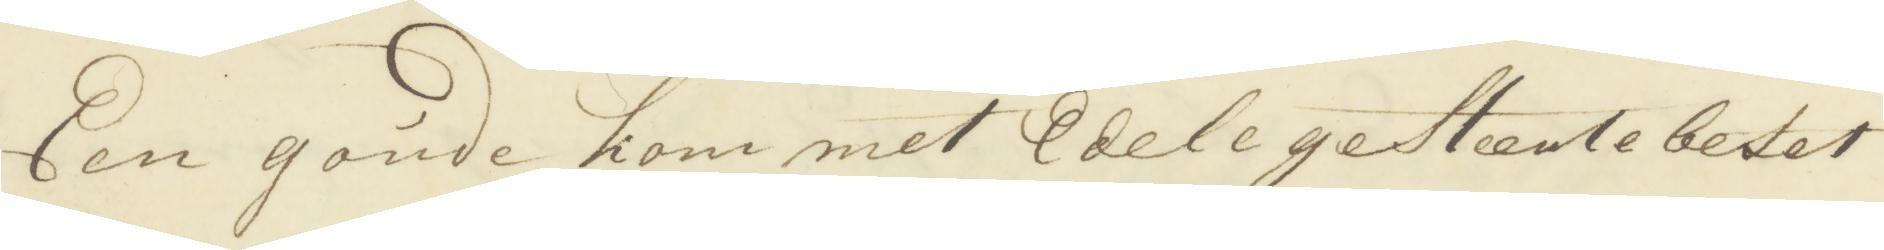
Een goude kom met Edele gesteente beset
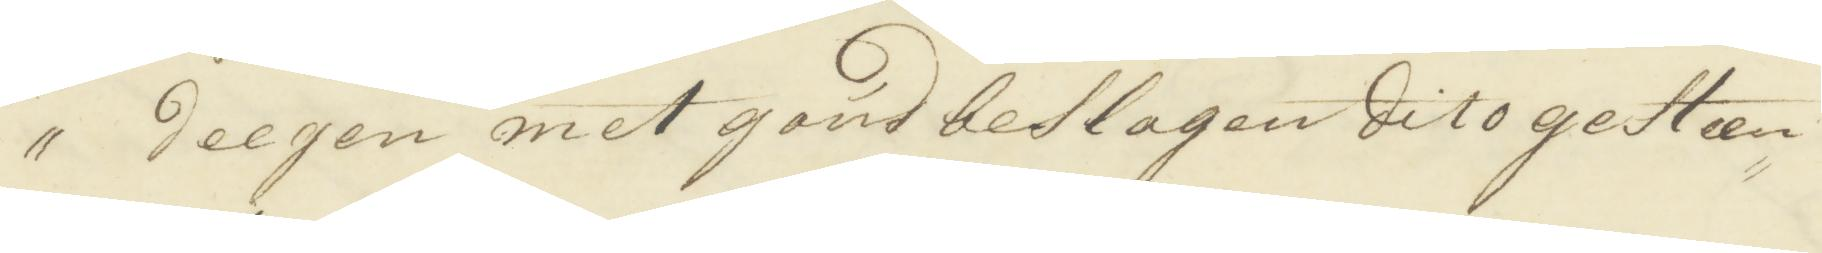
„ deegen met goud beslagen dito gesteen„
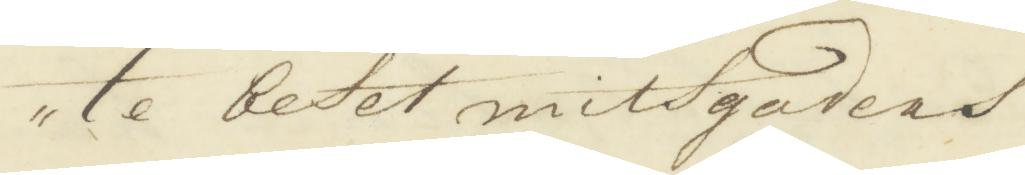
„te beset mitsgaders
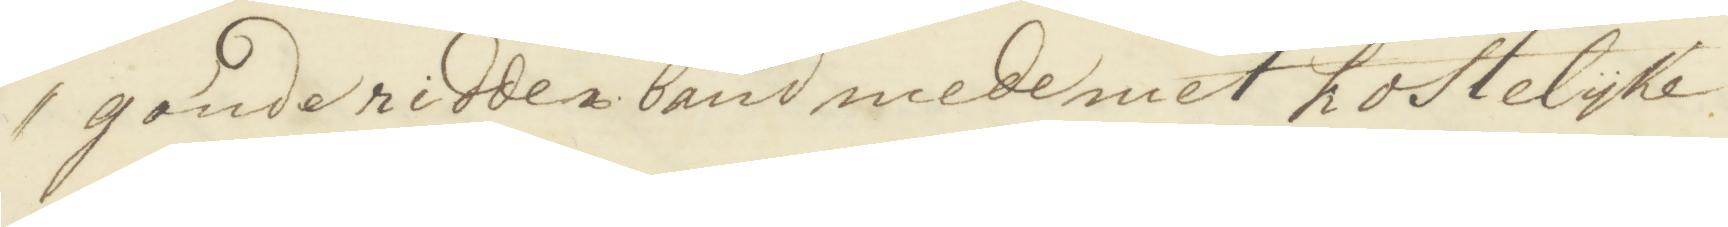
„ goude ridder band mede met kostelijke
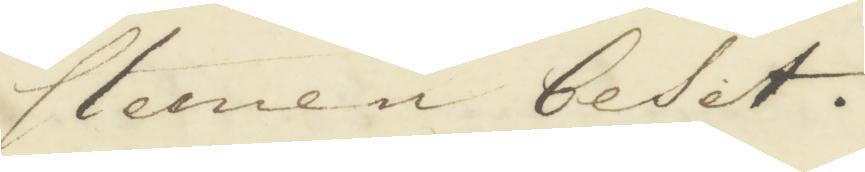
steenen beset.
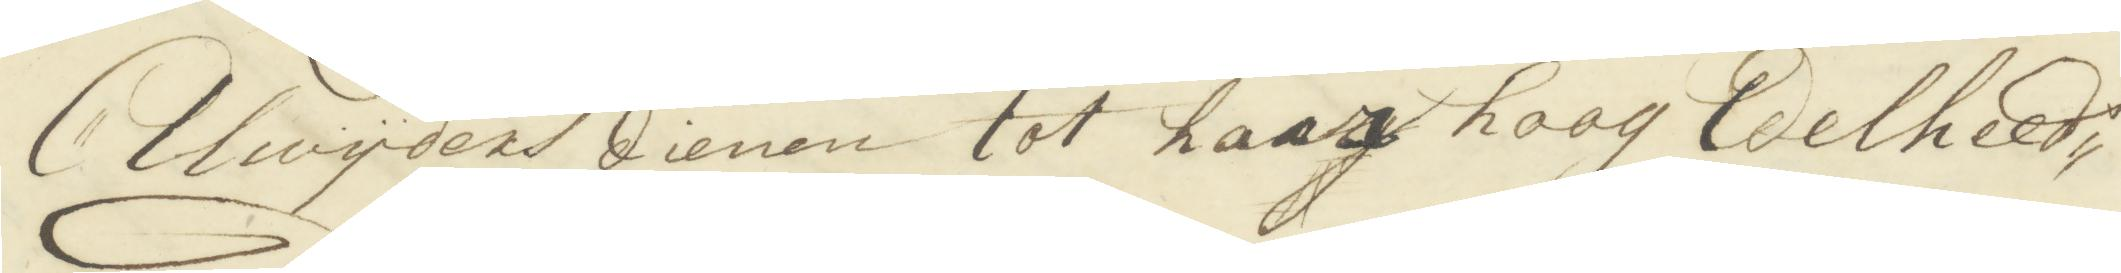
Alwijders dienen tot haar hoog Edelheed„s
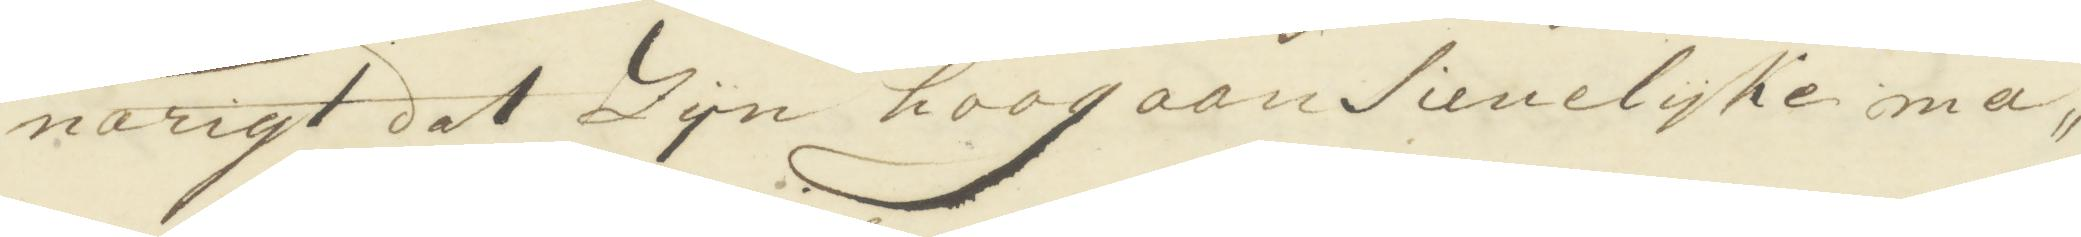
narigt dat zijn hoog aansienelijke ma„
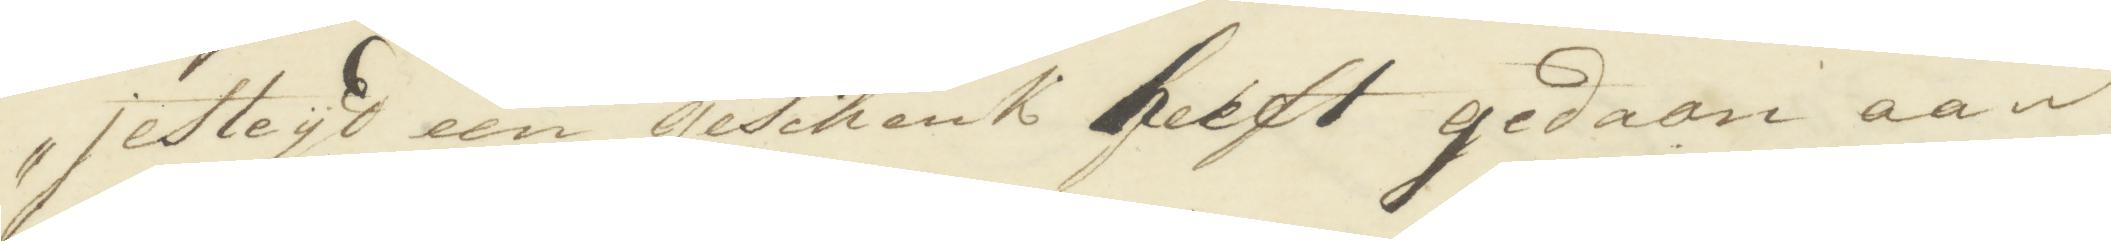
„jesteijd een geschenk heeft gedaan aan
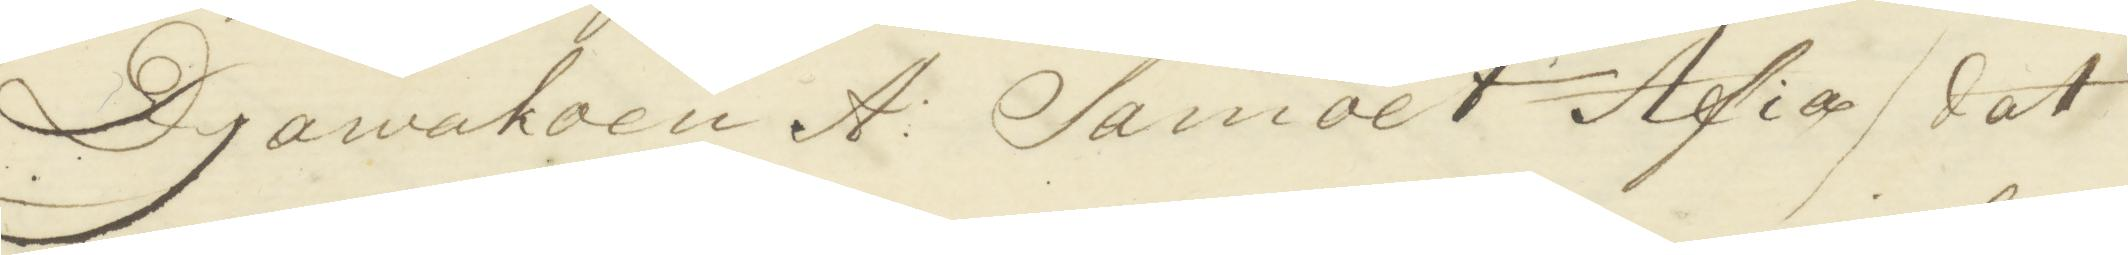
Djawakoen A: Samoet Afia / dat
